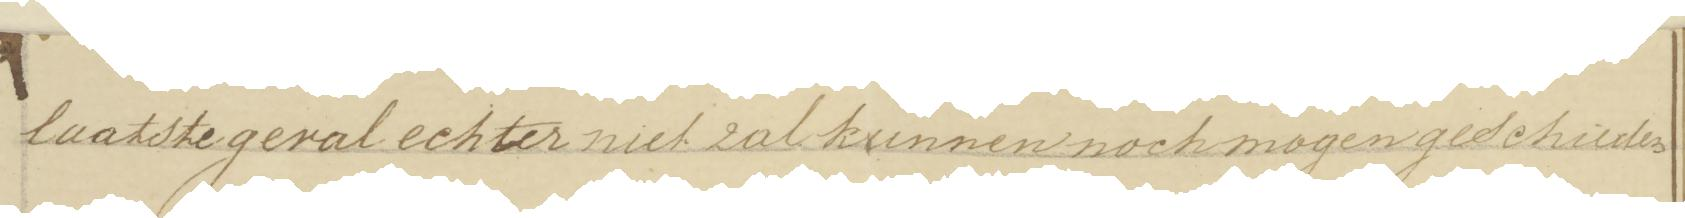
laatste geval echter niet en kunnen noch mogen geschieden
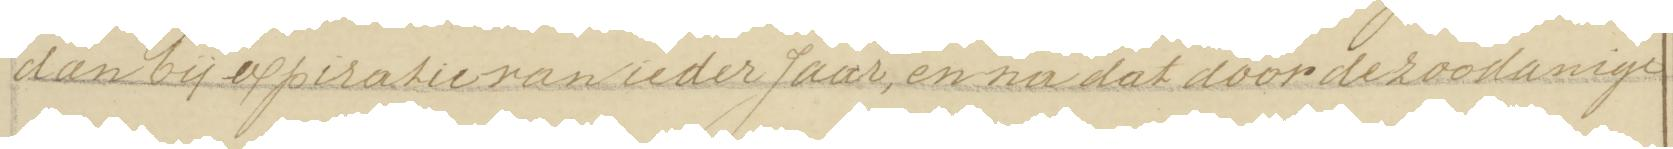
dan bij expiratie van ieder Jaar, en na dat door de zoodanige
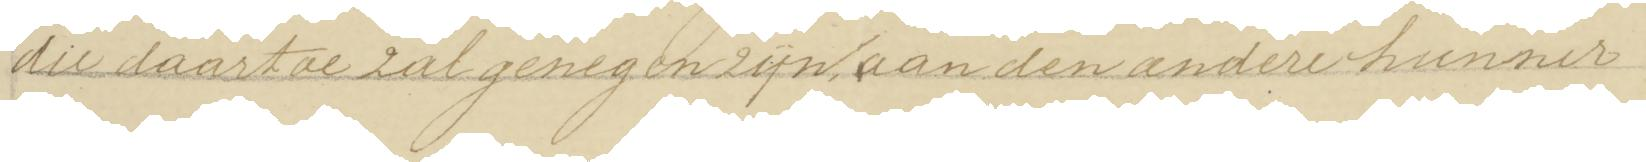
die daartoe zal genegen zijn, aan den andere hunner
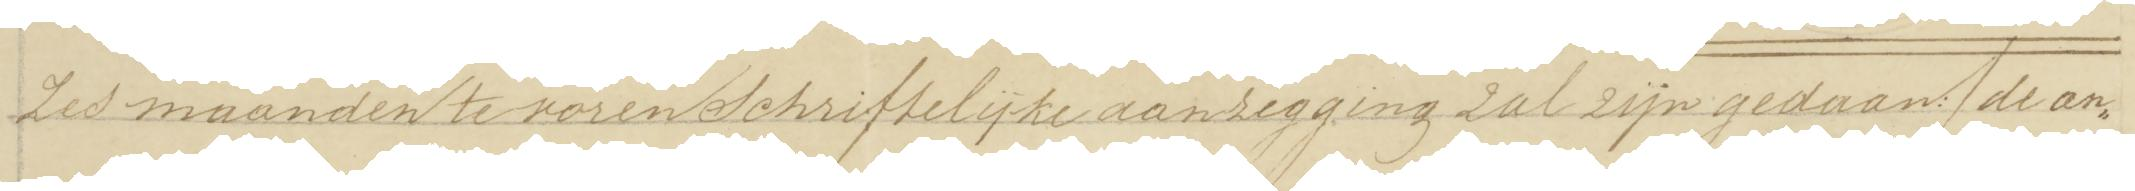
zes maanden te voren schriftelijke aanzegging zal zijn gedaan:/ de an„
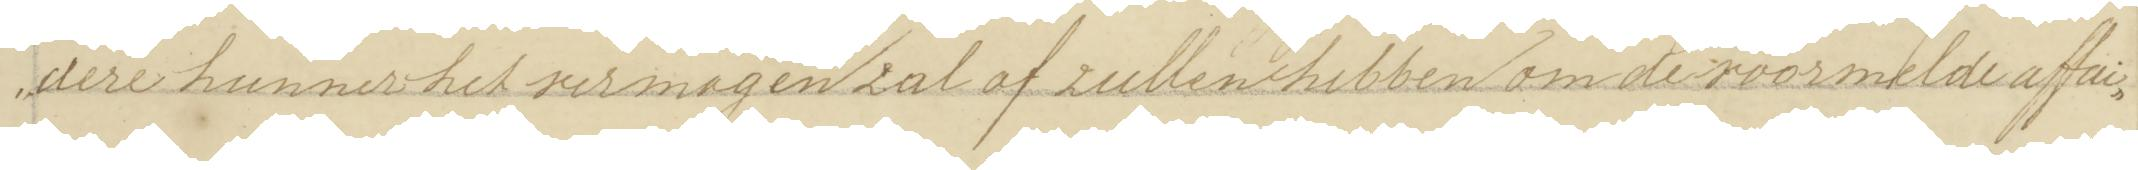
„dere hunner het vermag en zal of zullen hebben om de voormelde affai„
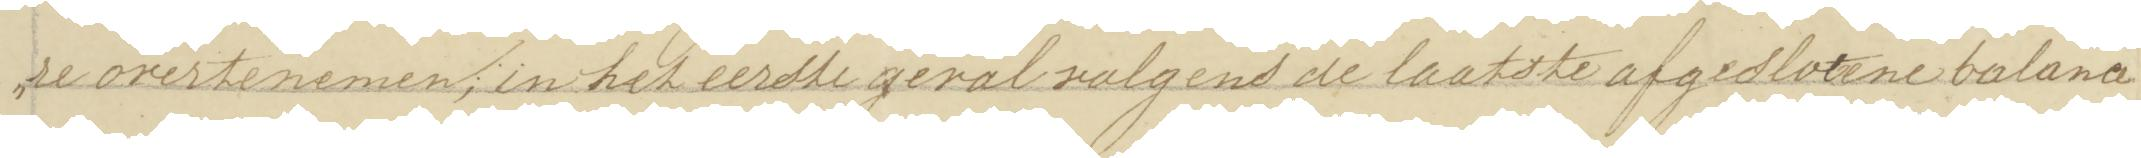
„re overtenemen; in het eerste geval volgens de laatste afgeslotene balance
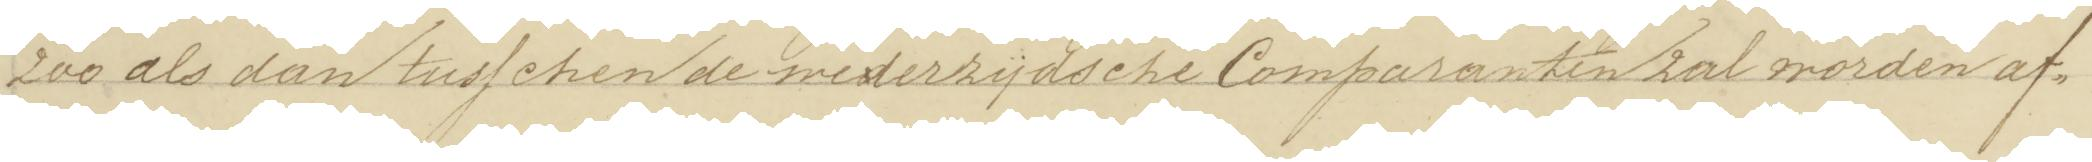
zoo als dan tusschen de wederzijdsche Comparanten zal worden af„
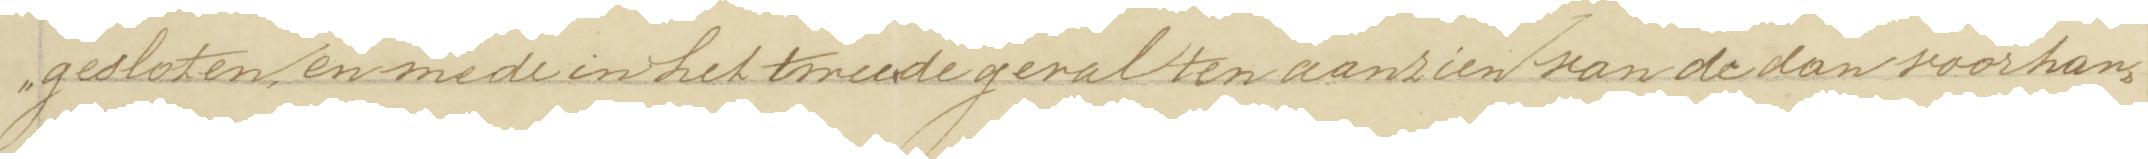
„gesloten, en mede in het tweede geval ten aanzien van de dan voorhan„
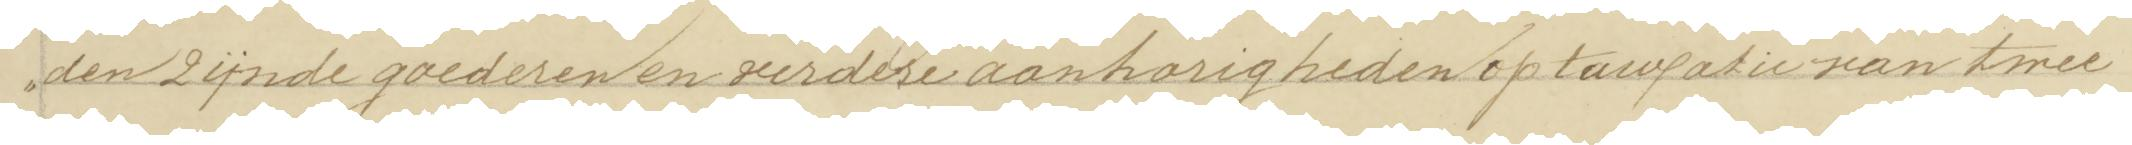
„den zijnde goederen en verdere aanhorigheden op tauxatie van twee
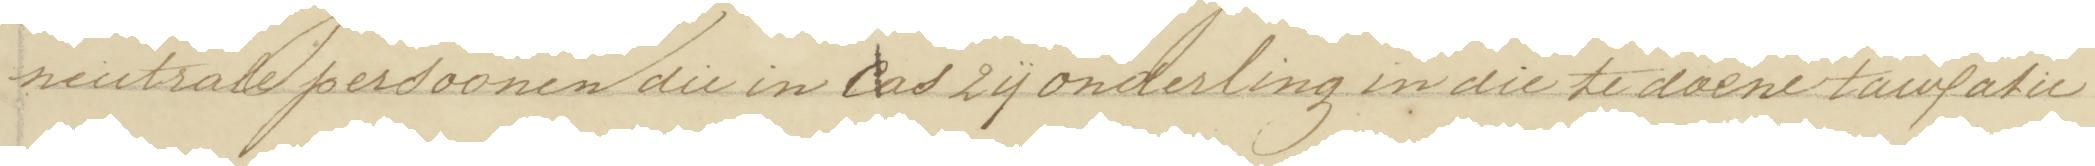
neutrale persoonen die in Cas zij onderling in die te doene tauxatie
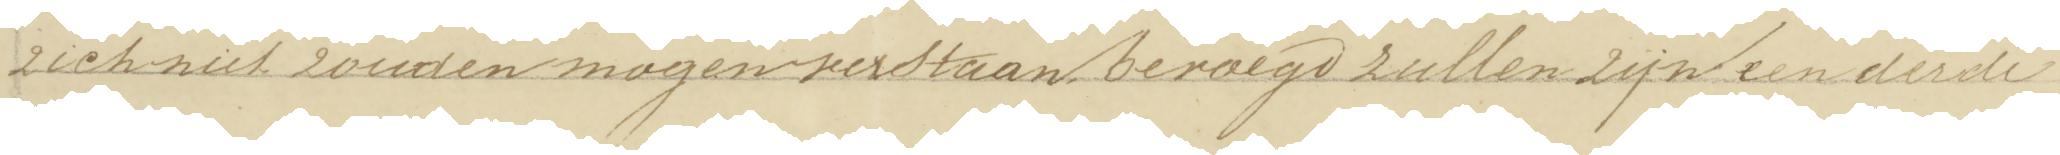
zich niet zouden mogen verstaan, bevoegd zullen zijn een derde
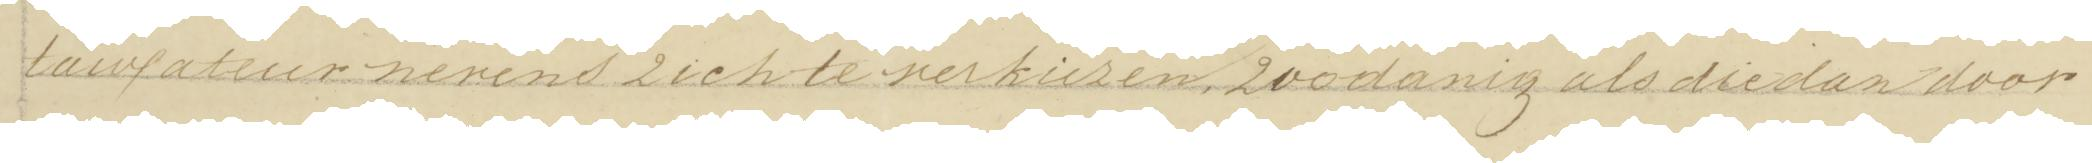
tauxateur nevens zich te verkiezen, zoodanig als die dan door
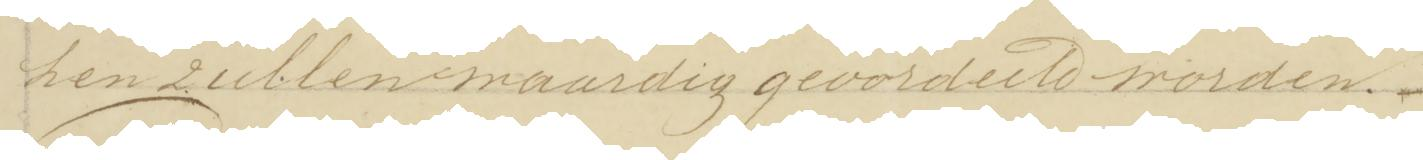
hen zullen waardig geoordeeld worden.
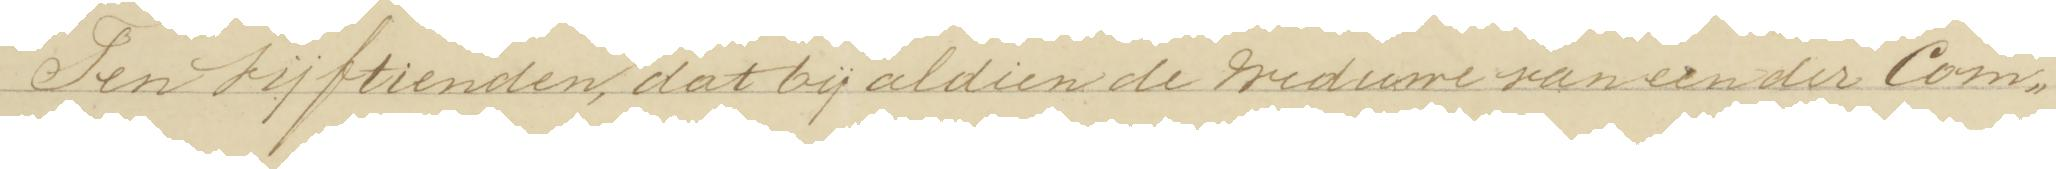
Ten vijftienden, dat bij aldien de weduwe van een der Com„
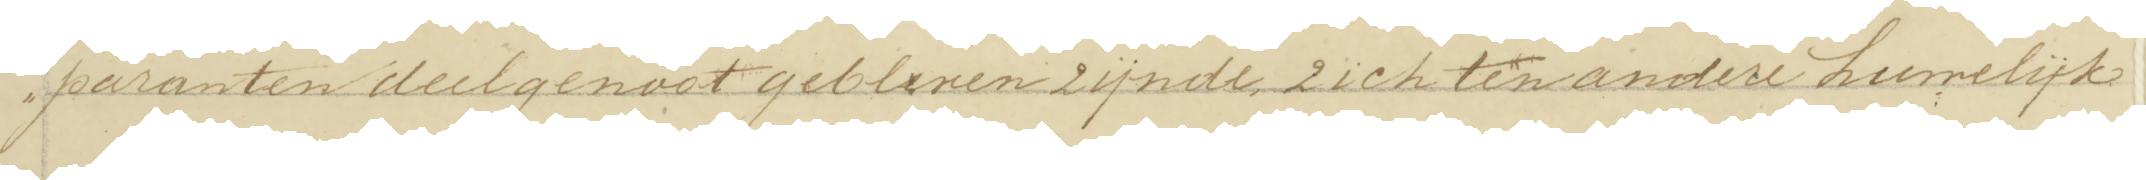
„paranten deelgenoot gebleven zijnde, zich ten andere huwelijk
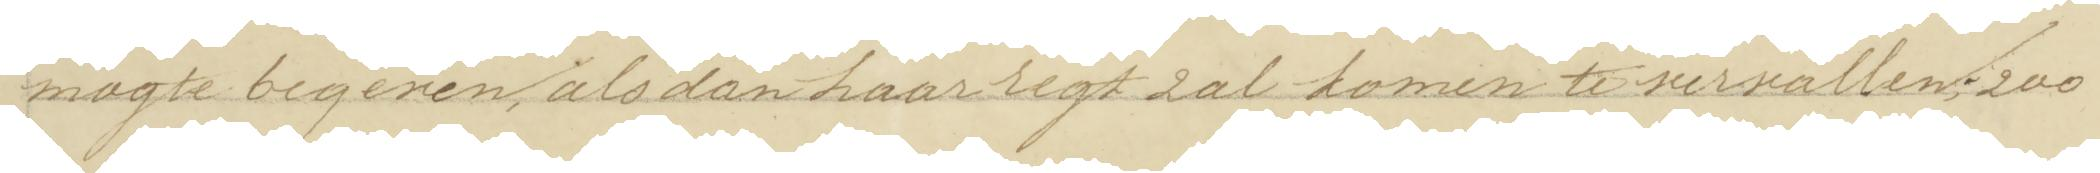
mogte begeven, als dan haar regt zal komen te vervallen; zoo
